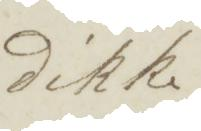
dikke
